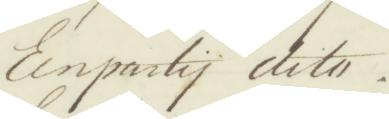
Een partij dito
